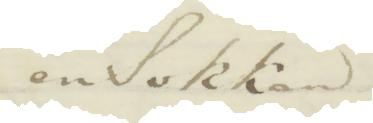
en sokken
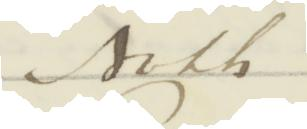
Noth
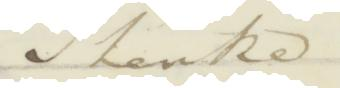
Stenke
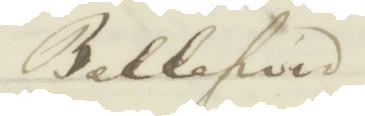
Bellefroid
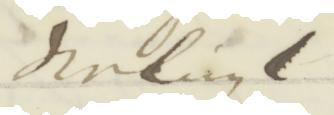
Verburgt
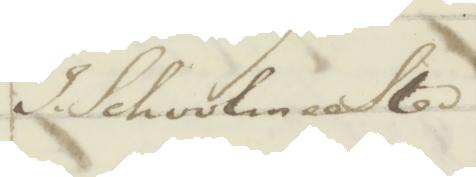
I Schoolmeester
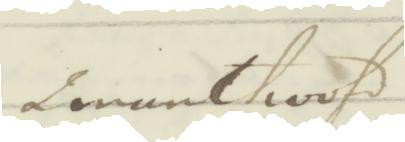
Zwarthoofd
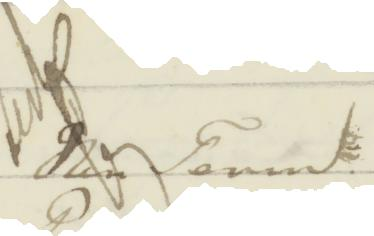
Van Term
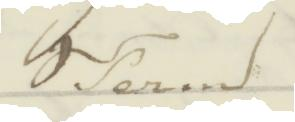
V Serm
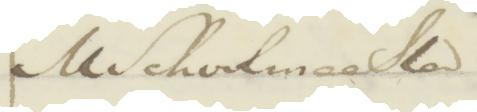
M Schoolmeester
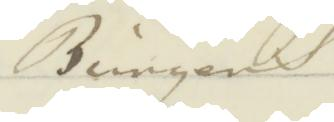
Burgers
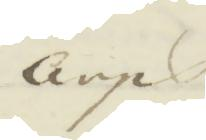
Arps
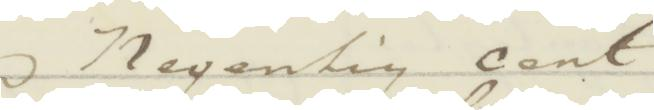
Negentig cent
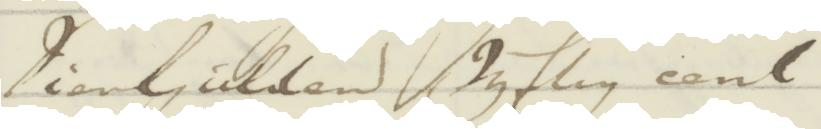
VierGulden Vyftig cent
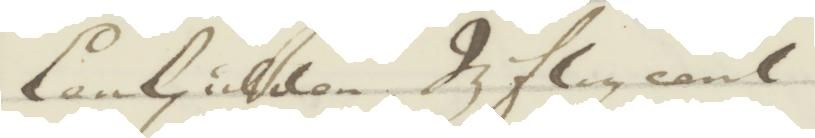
Een Gulden Vyftig cent
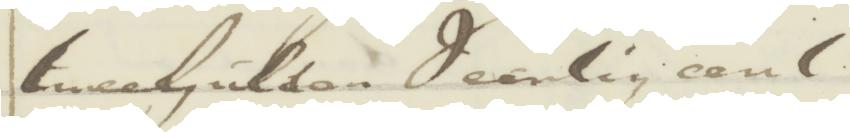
tweeGulden Veertig cent
